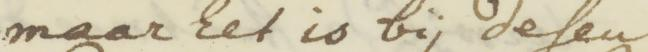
maar het is bij desen
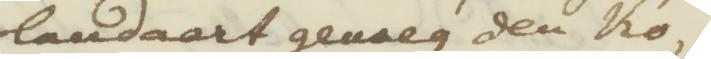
landaart genoeg den Ko„
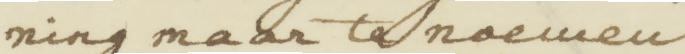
ning maar te noemen
